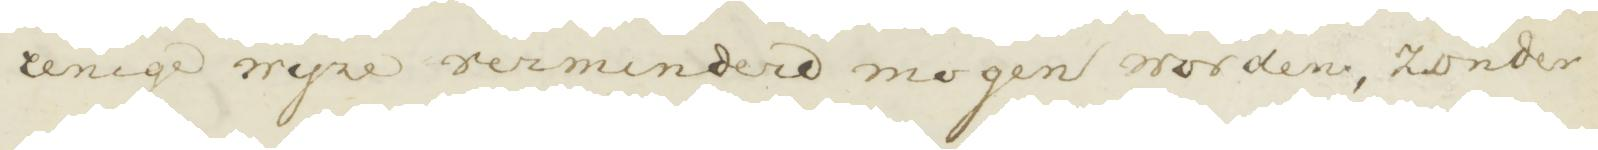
eenige wyze verminderd mogen worden, zonder
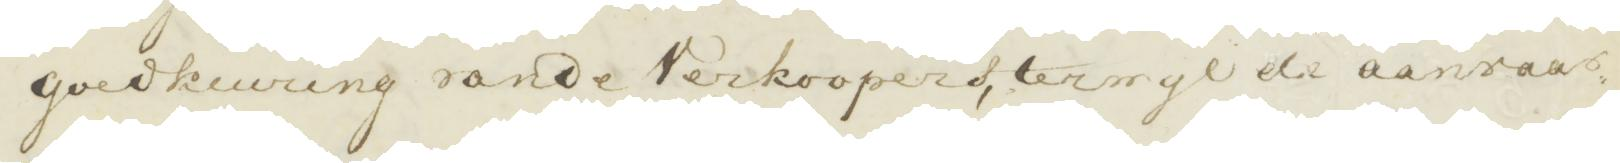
goedkeuring van de Verkoopers, terwijl de aanvaar„
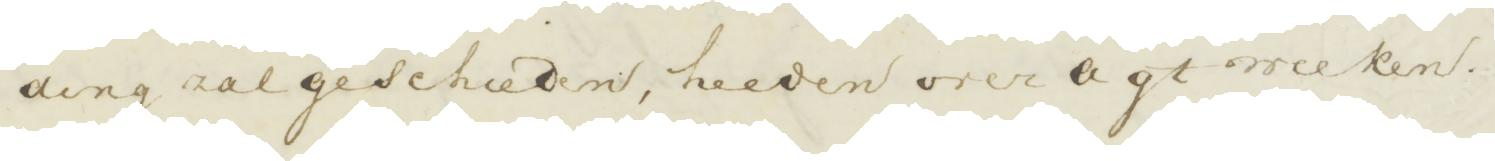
ding zal geschieden, heeden overlegt welken.
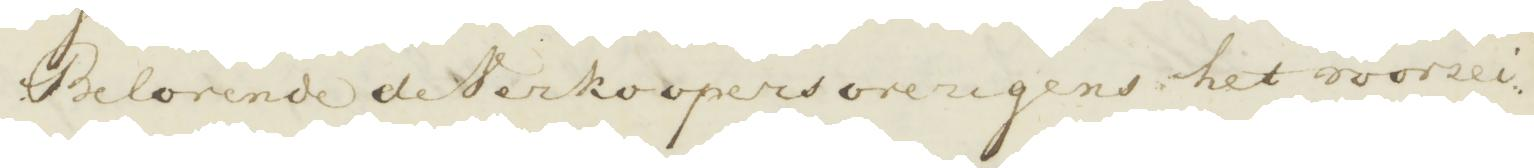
Belovende de Verkoopers overigens het voorzei„
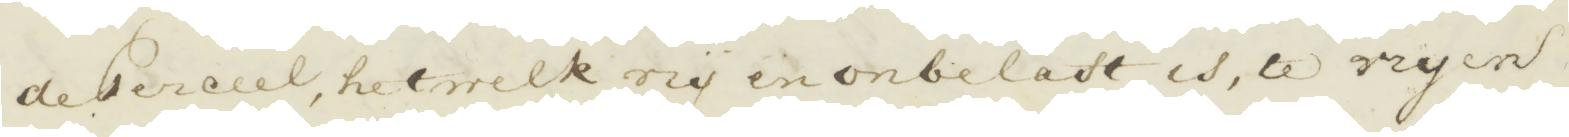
de Perceel, het welk vrij in onbelast is, te vrijen
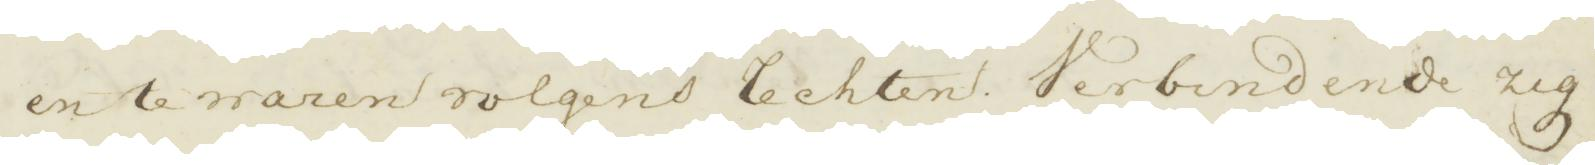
en te waren volgens rechten. Verbindende zig
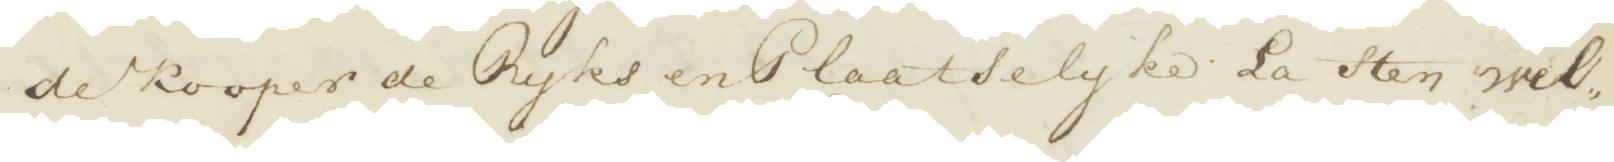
de kooper de Ryks en Plaatselijke lasten wel„
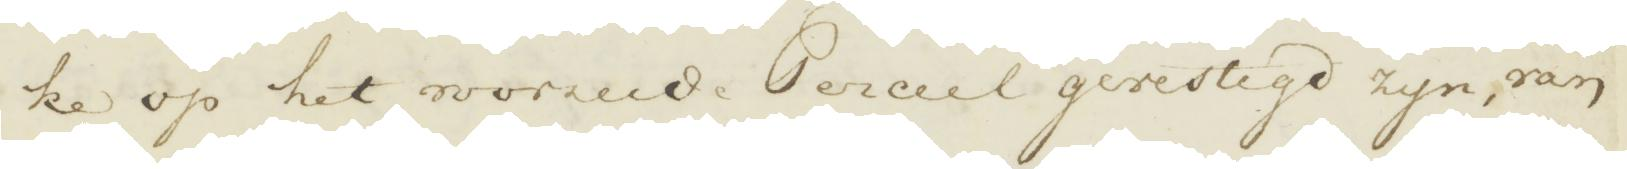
ke op het voorzeide Perceel gevestigd zyn, van
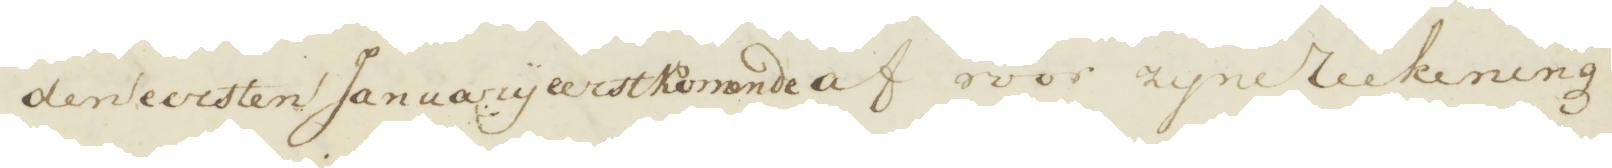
den eersten Januarij eerst komende af voor zijne reekening
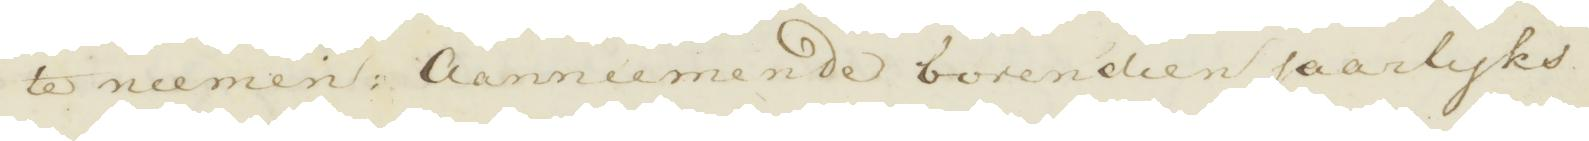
te neemen: Aanneemen de bovendien jaarlyks
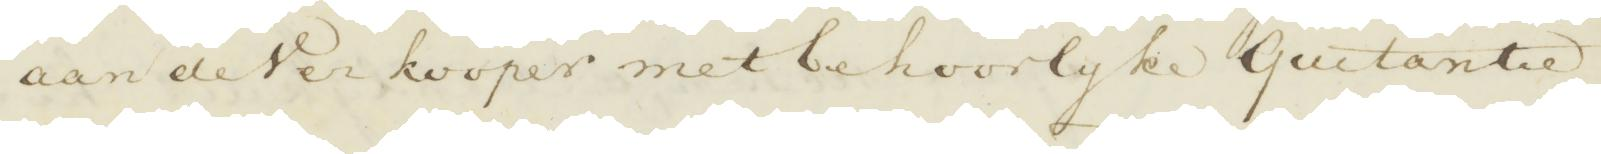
aan de Verkooper met behoorlyke quitantie
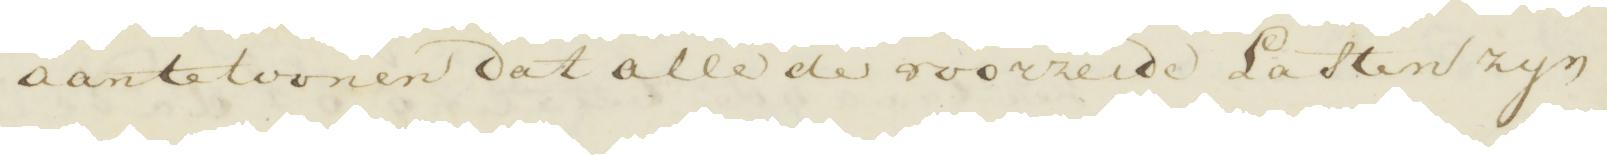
aan te toonen dat alle de voorzeide lasten zyn
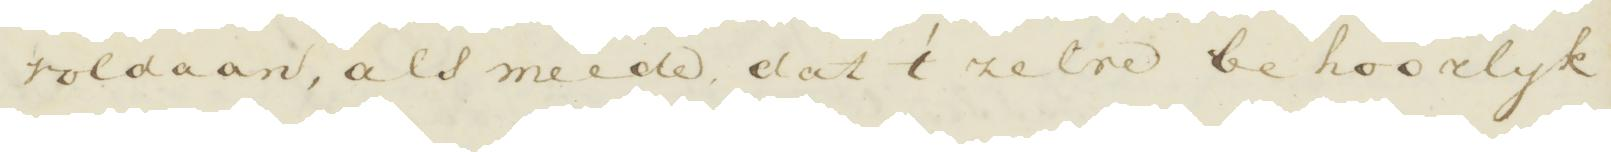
voldaan, als meede dat ’t zelve behoorlyk
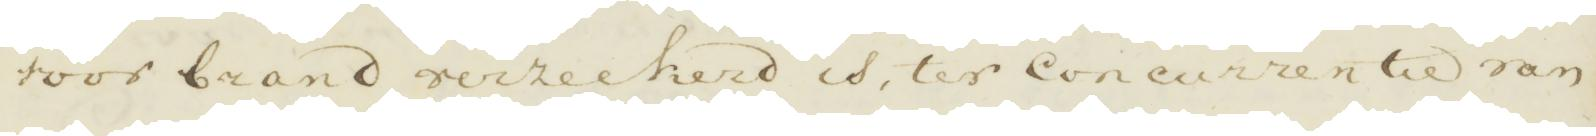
voor brand verzeekerd is, ter concurrentie van
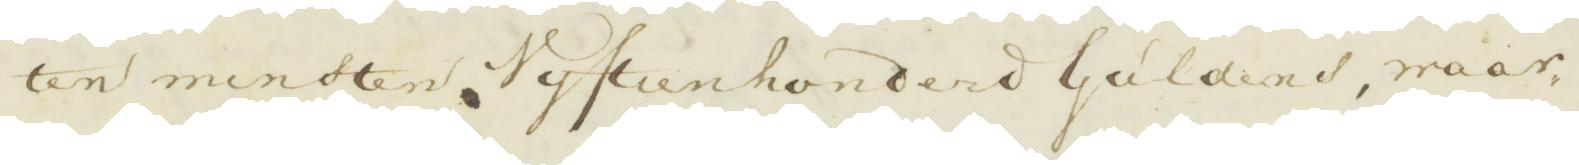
ten minsten Vyftienhonderd guldens, waar„
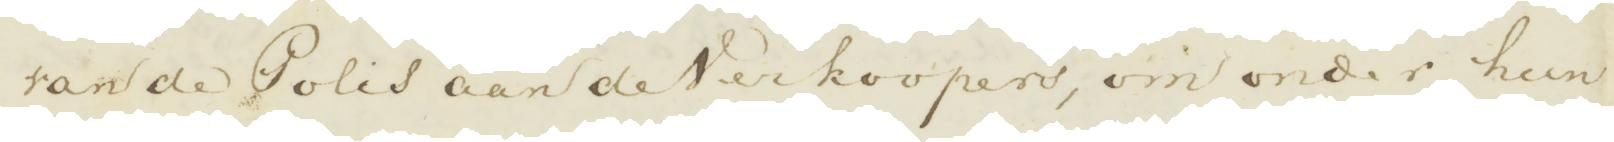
van de Polis aan de Verkoopers, om onder hun
